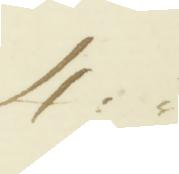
4.„
